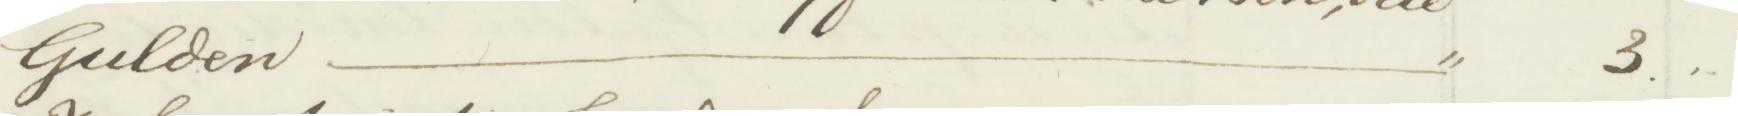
Gulden —„ 3.„
